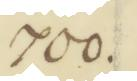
700.
